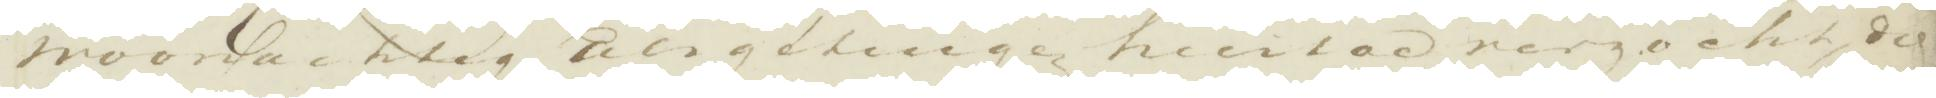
woonachtig als getuigen hiertoe verzocht, die
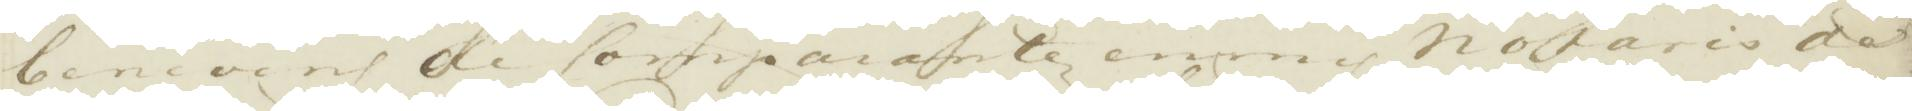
benevens de Comparanten en my notaris de
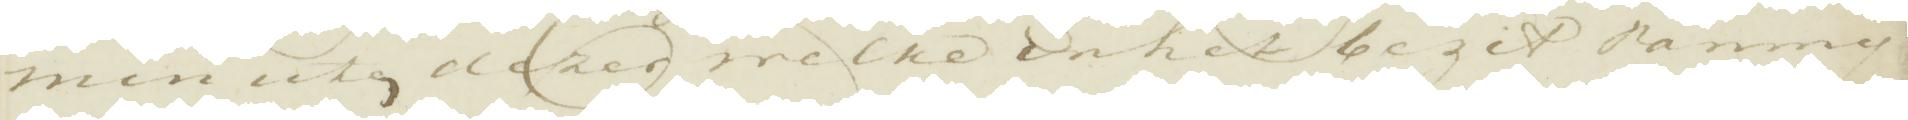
minute dezer welke in het bezit van my
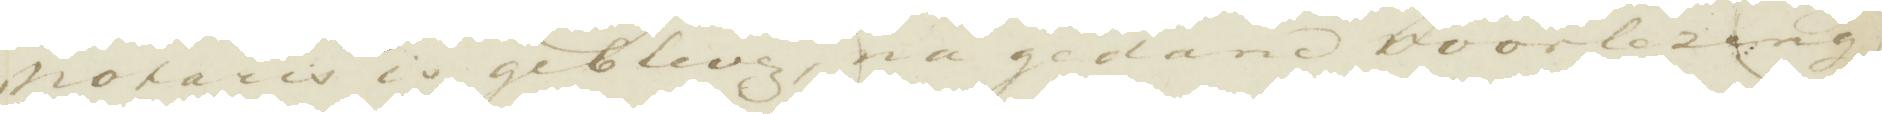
notaris is gebleven, na gedane voorlezing
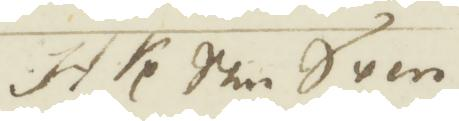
Hk van Veen
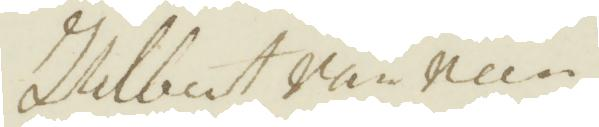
Hilbert van Veen
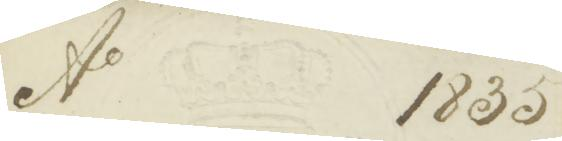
Ao 1835
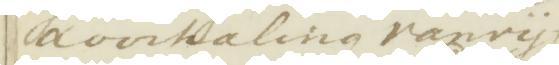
doorhaling van vijf
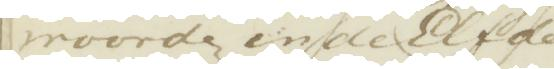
woorden in de Elfde
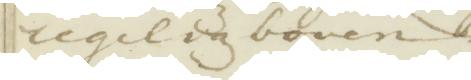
regel van boven
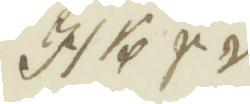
H K v V
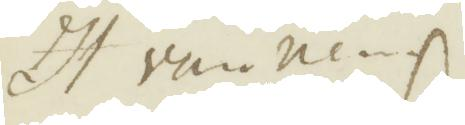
H van Veen
